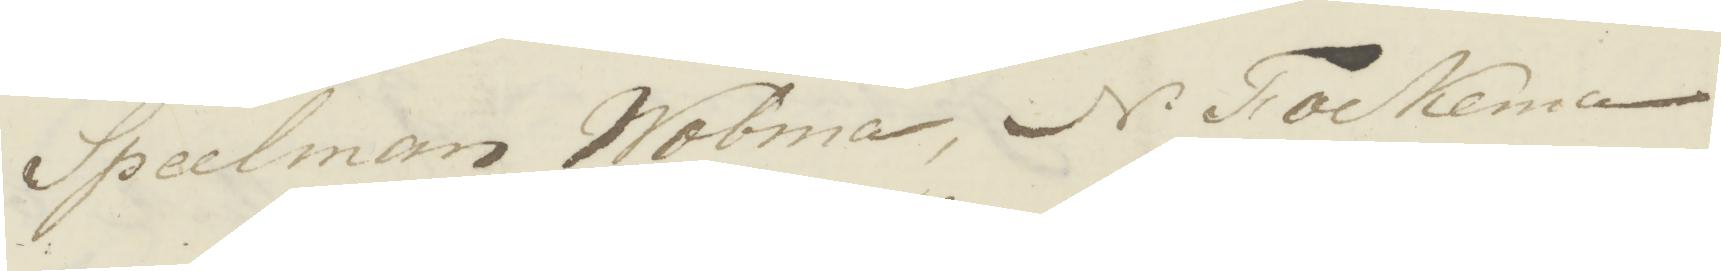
Speelman Wobma, N Foekema
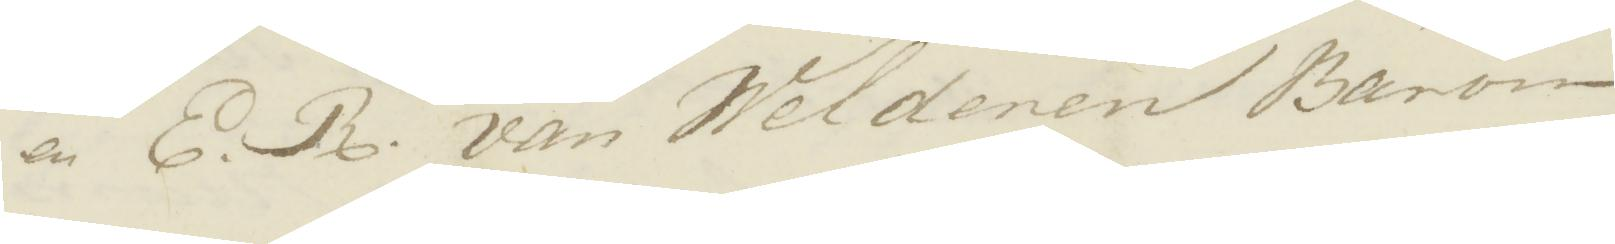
en E. R. van Weldenen Baron
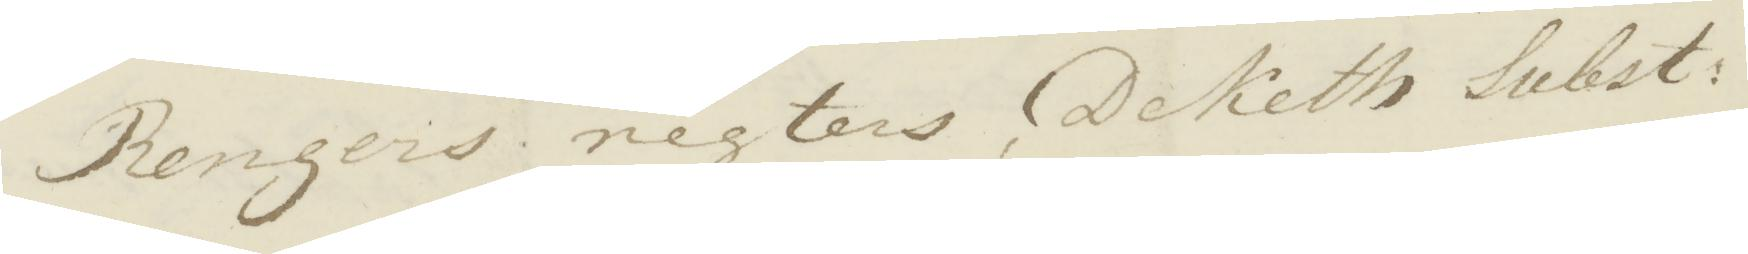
Rengers. regters, Deketh subst:
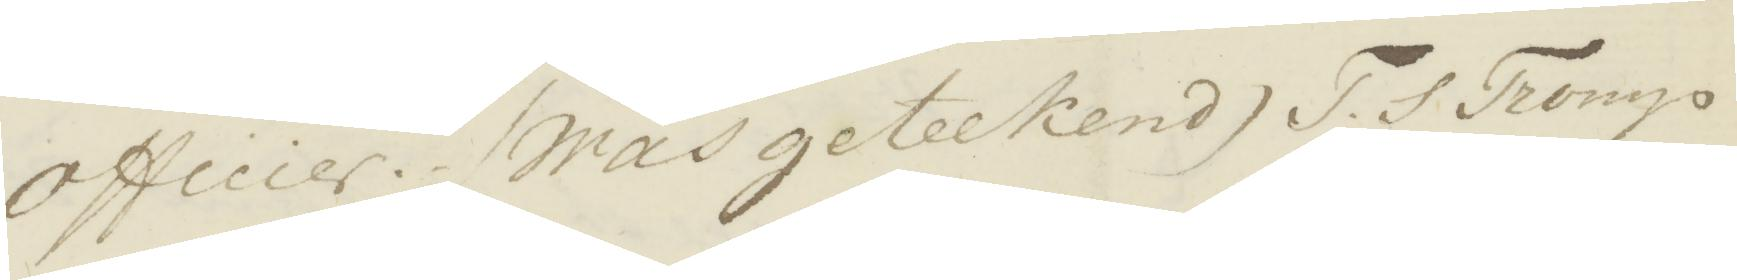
officier. - /was geteekend/ T. S Tromp
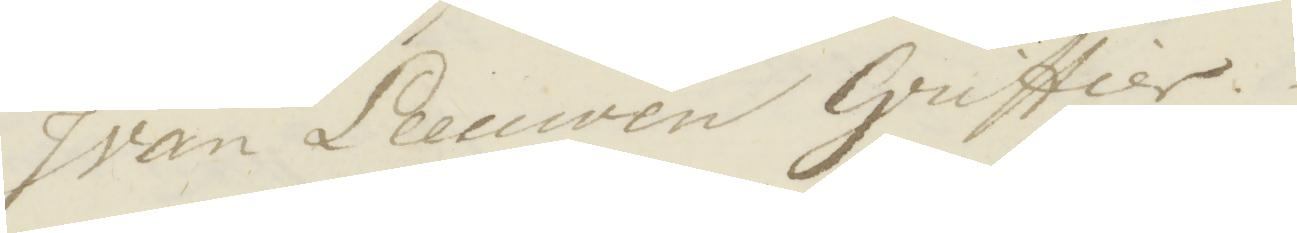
J van Leeuwen Griffier.
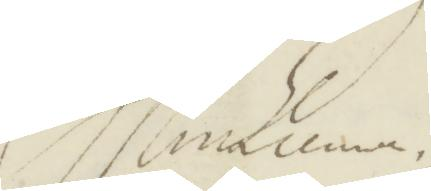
J van Leeuwen
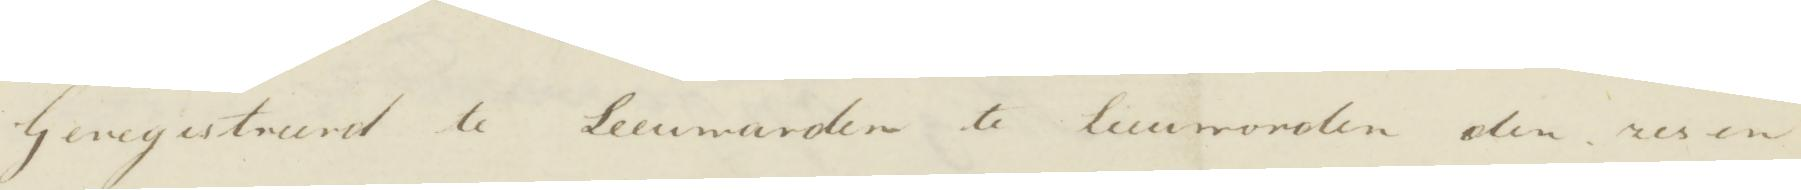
Geregistreerd te Leeuwarden te Leeuwarden den zes en
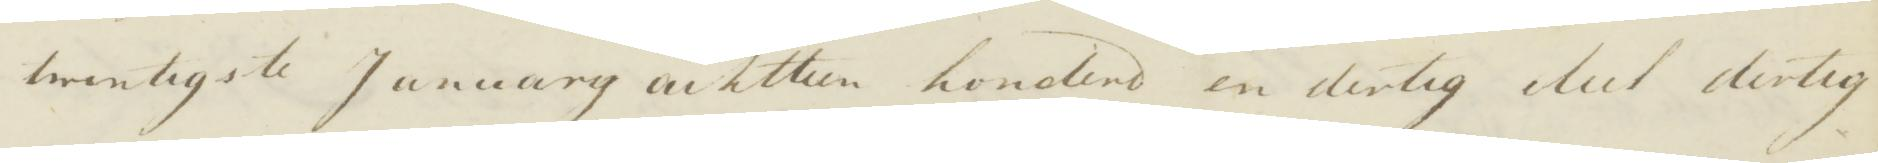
twintigste January achttien honderd en dertig deel dertig
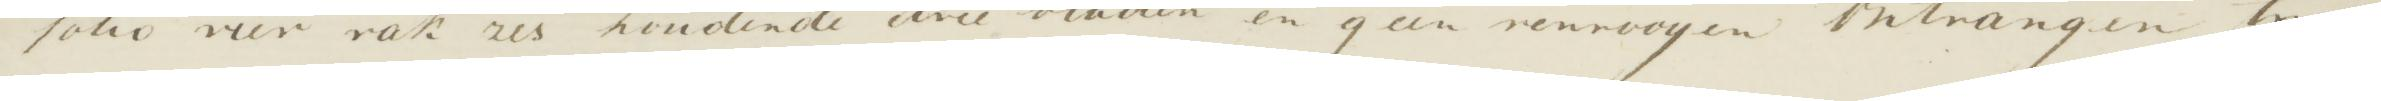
folio vier vak zes houdende drie bladen en geen renvooijen Ontvangen twee
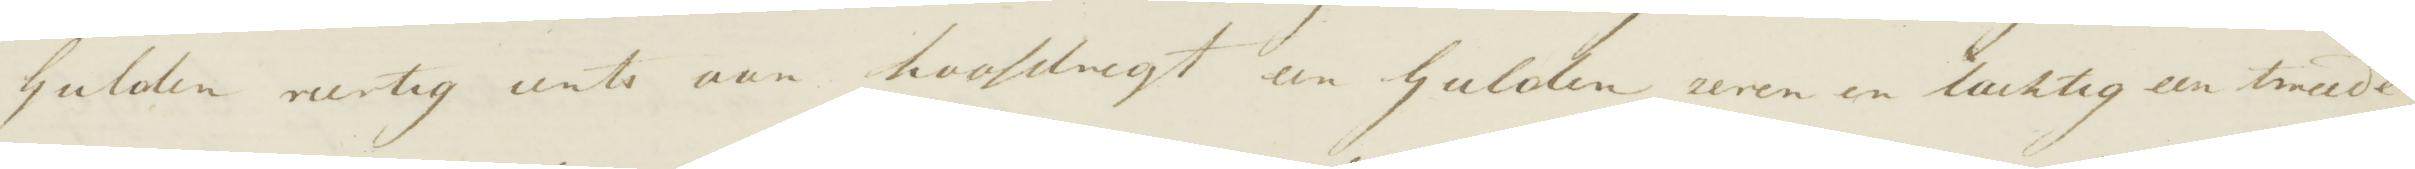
Gulden veertig cents aan hoofdregt een Gulden zeven en tachtig een tweede
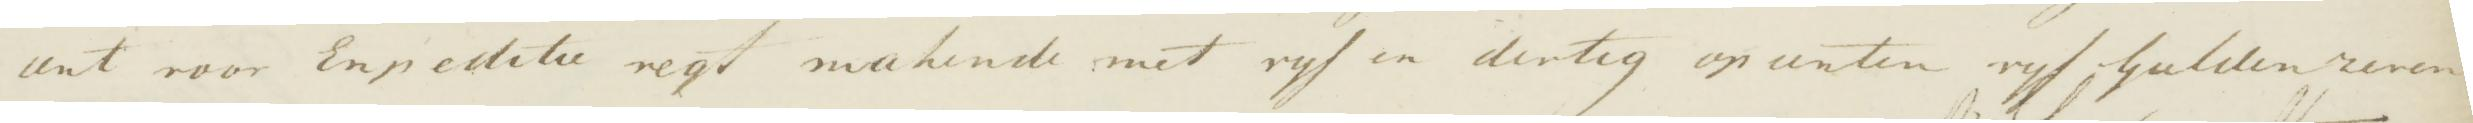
cent voor Enpedetie regt makende met vyf en dertig op centen vyf Gulden zeven
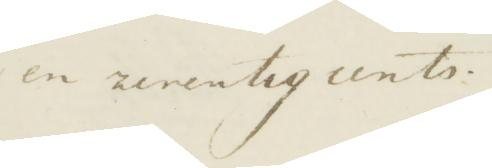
en zeventig cents.
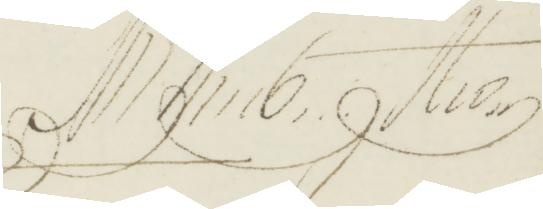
AD Limburg Stirum
